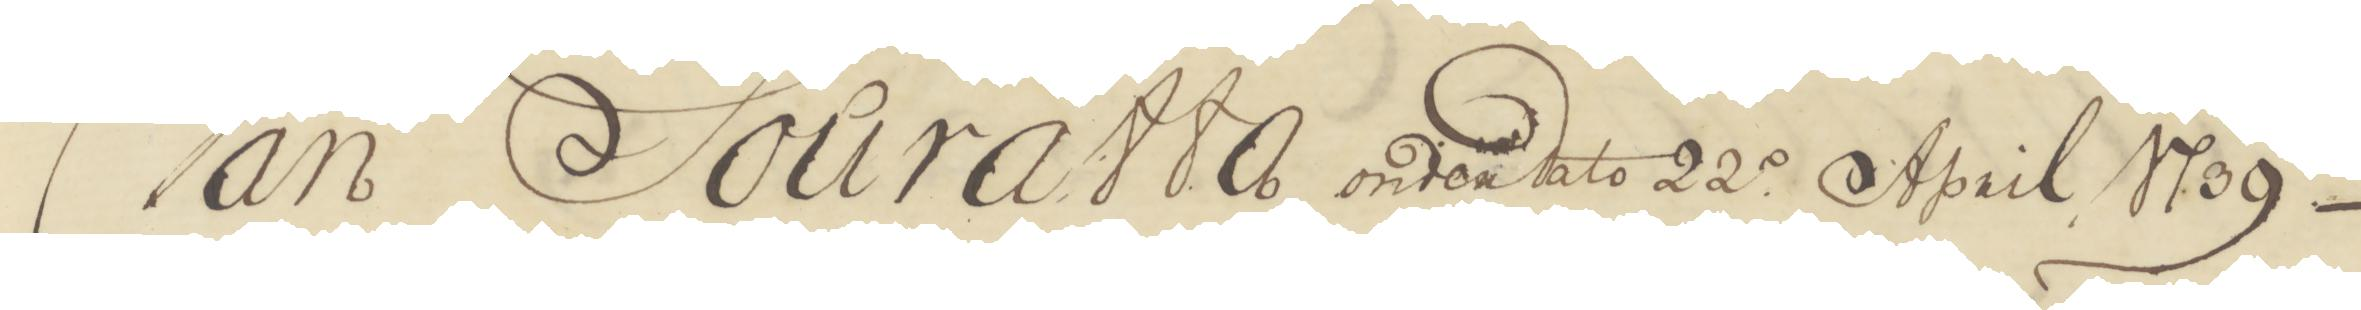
Van Souratta onder dato 22.e April 1739. —
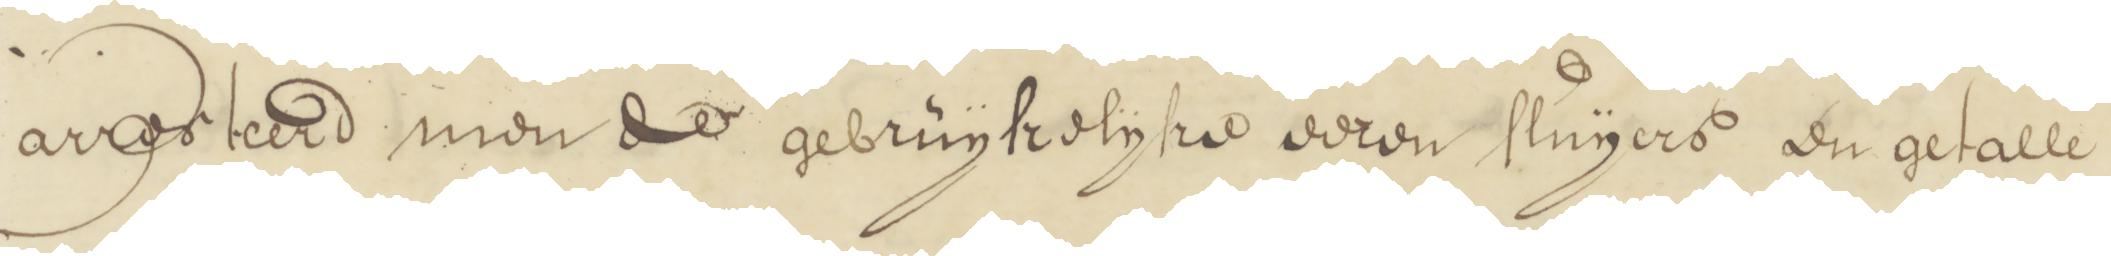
arresteerd men de gebruijkelijke eeren sluijers ten getalle
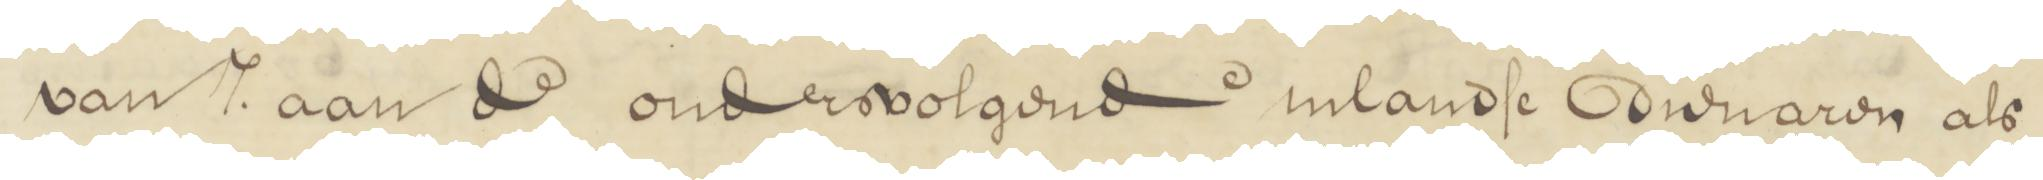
van 7. aan de ondervolgende inlandse dienaren als
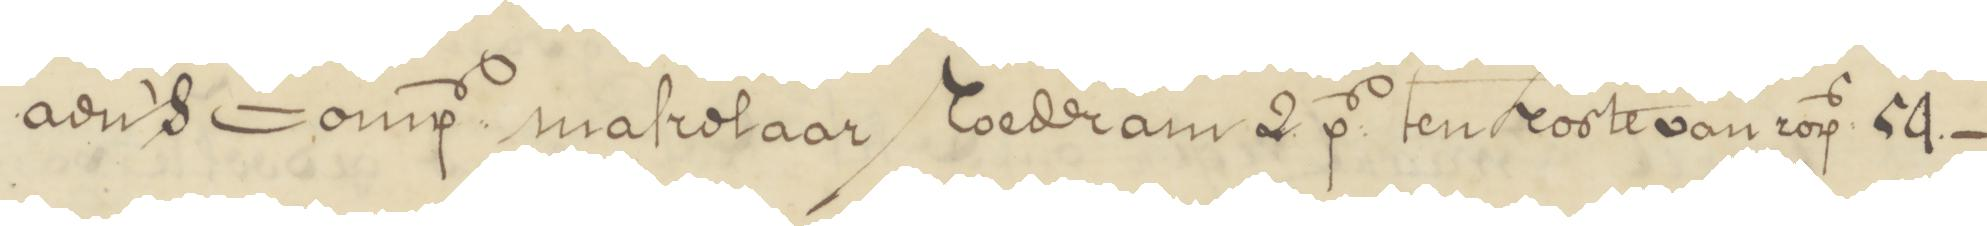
aen 's Comp:s makelaar Roederam 2 p:s ten koste van rop:s 54. —
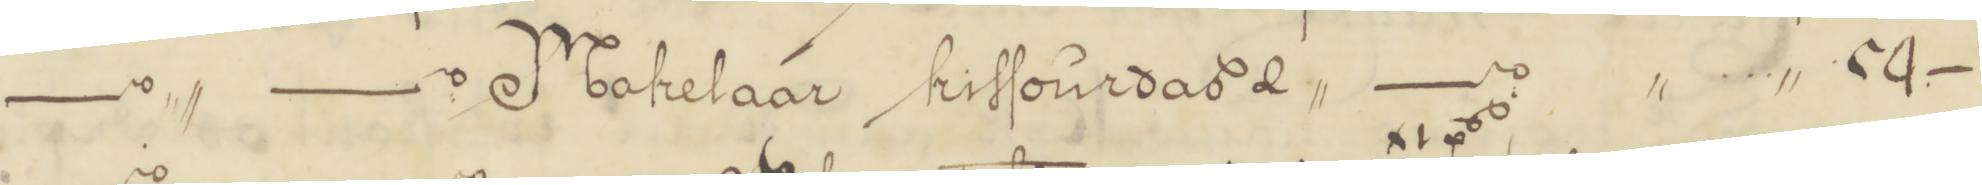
do „ „ d:o Makelaar kissourdas 2 „ d:o „ - - - „ 54. —
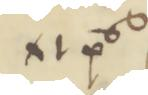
x 1 ps
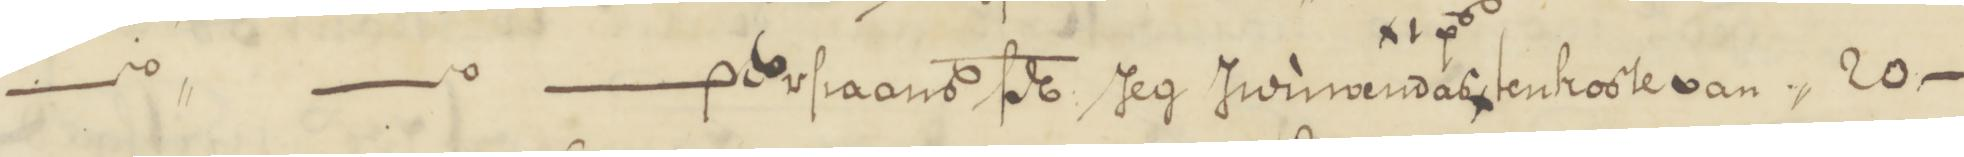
do „ do persiaans sec: Jeg Jieuwendas, ten koste van - - „ 20. —
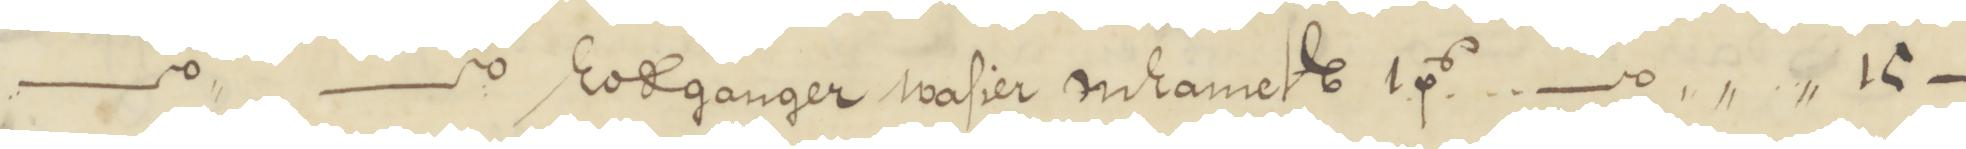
„ do „ d:o hofganger wasier inhameth 1. p.s - - - do „ „ - - „ 15 —
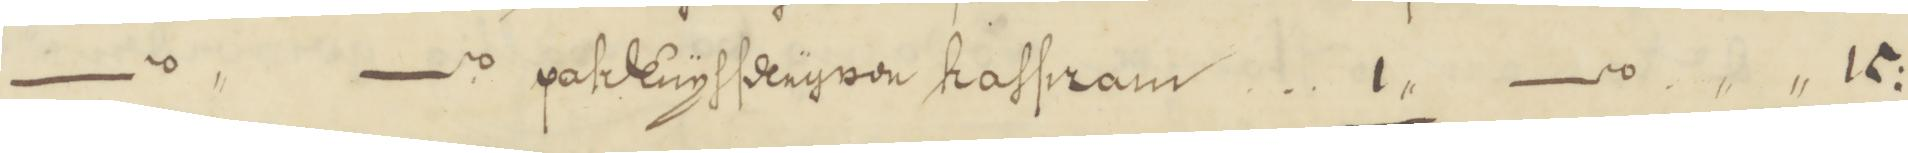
do „ d.o pakhuijsschrijven kassiram - - - 1 „ do - - „ „ 15:
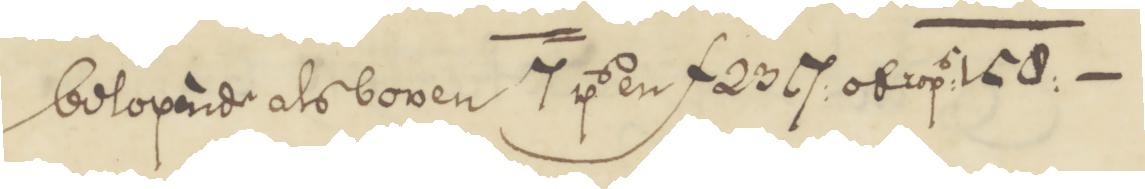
belopende als boven 7 ps en ƒ 2317: of rop:s 158: —
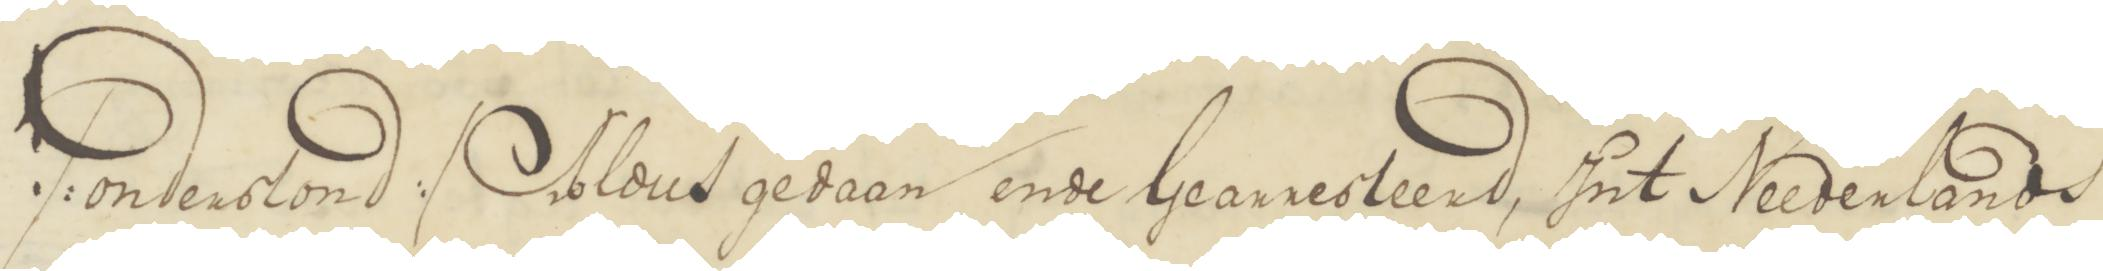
/:onderstond:/ Aldus gedaan ende Gearresteerd, Jn't Neederlands
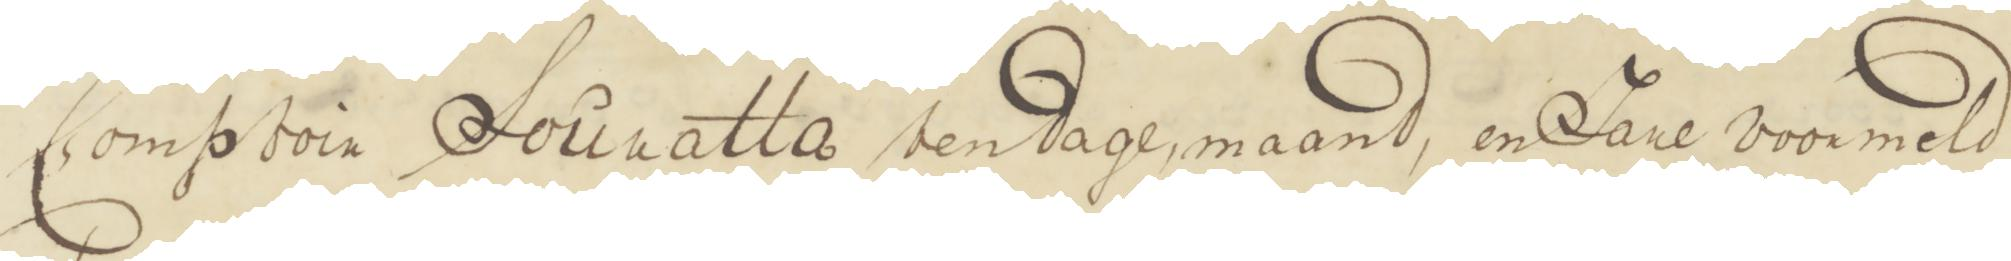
Comptoir Souratta ten dage, maand, en Iare voormeld
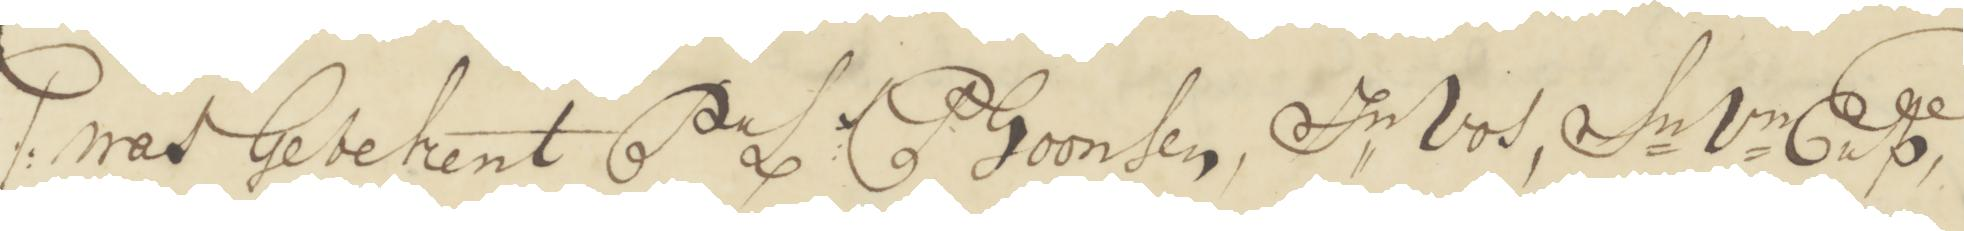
/:was Getekent Pr L:s Phoonsen, I„n Vos, S=n V=n Erp,
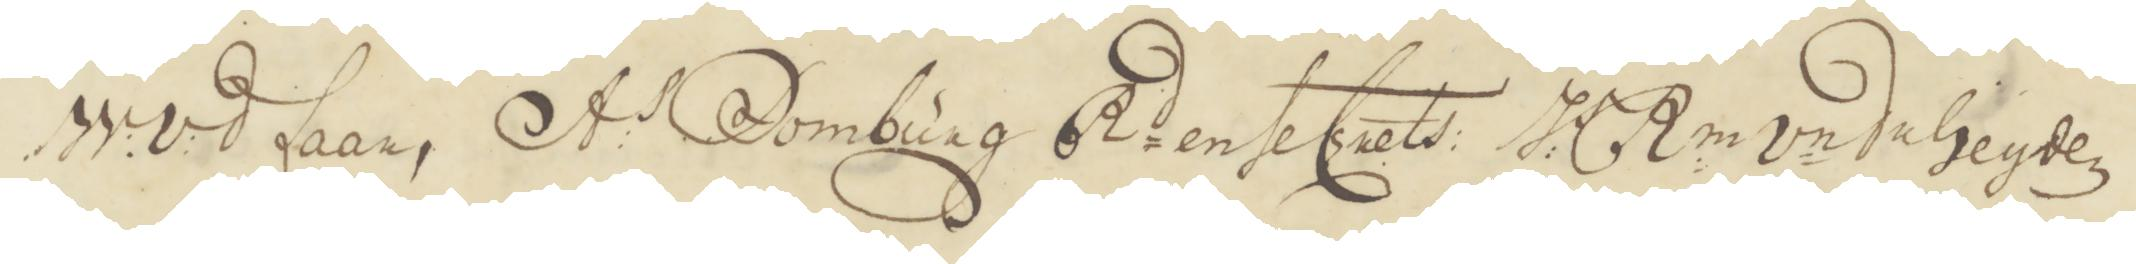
W: v: d Laar, A:s Domburg R=d en se Crets: I:s R:m v=n dr Heijden
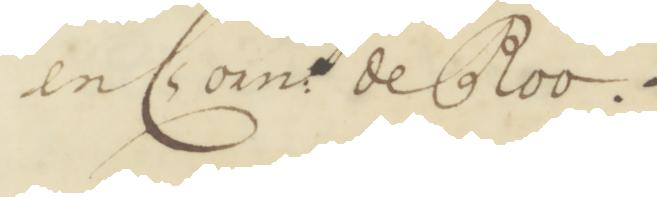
en Corn:s de Roo. —
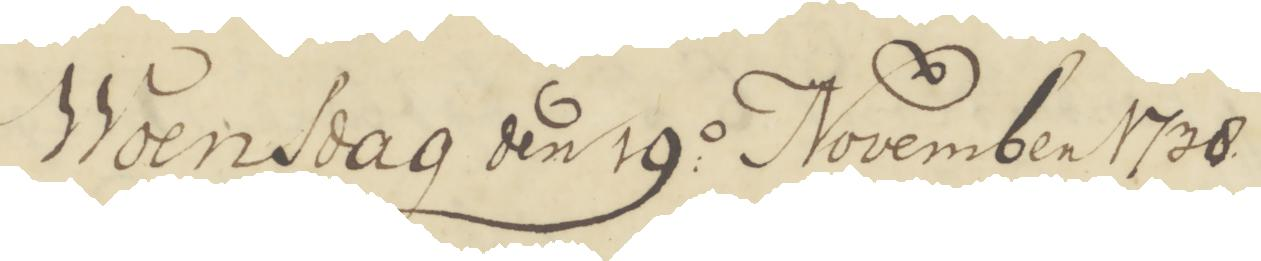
Woensdag den 19:o November 1738.
